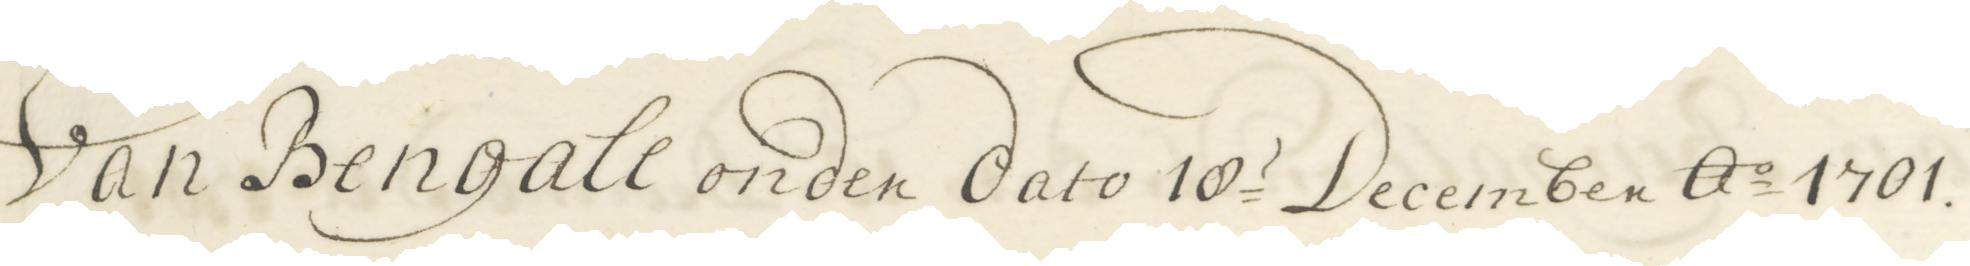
Van Bengale onder dato 18=' December A=o 1701.
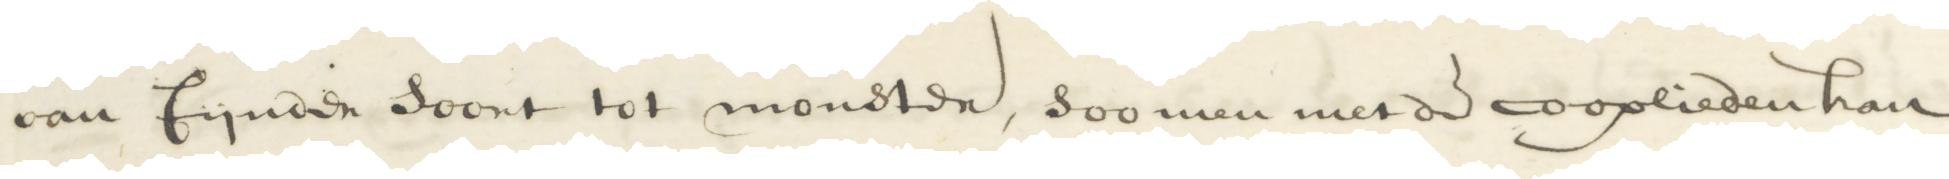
van fijnder soort tot monster, soo men met de cooplieden kan
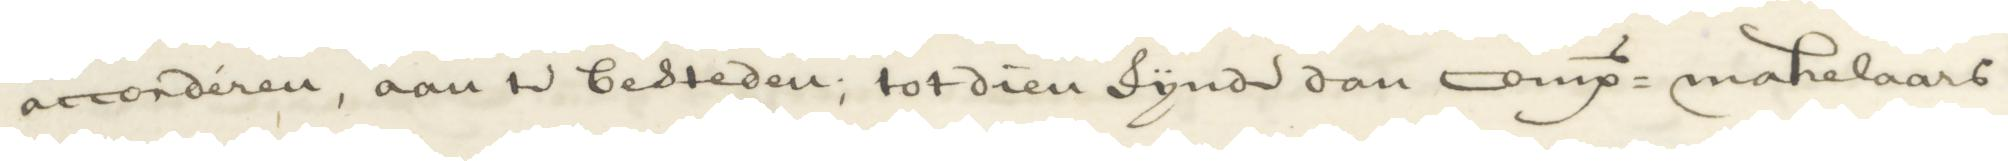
accorderen, aan te besteden; tot dien Eijnde dan Comp=s makelaars
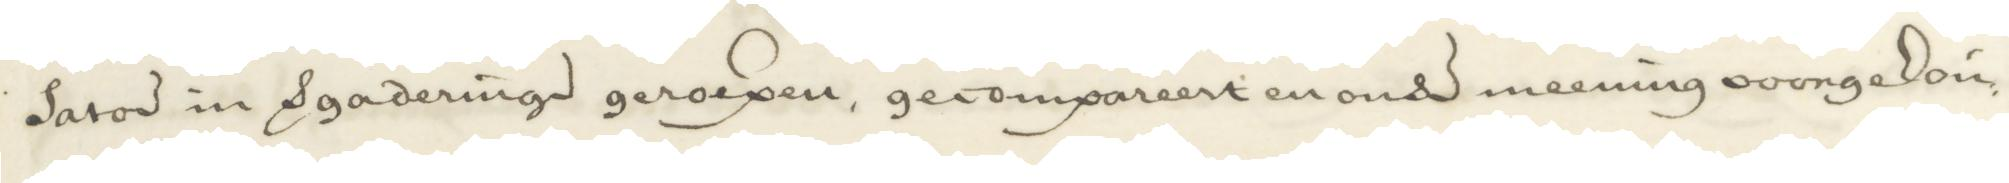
satoe in vergaderinge geroepen, gecompareert en onse meening voorgehou„
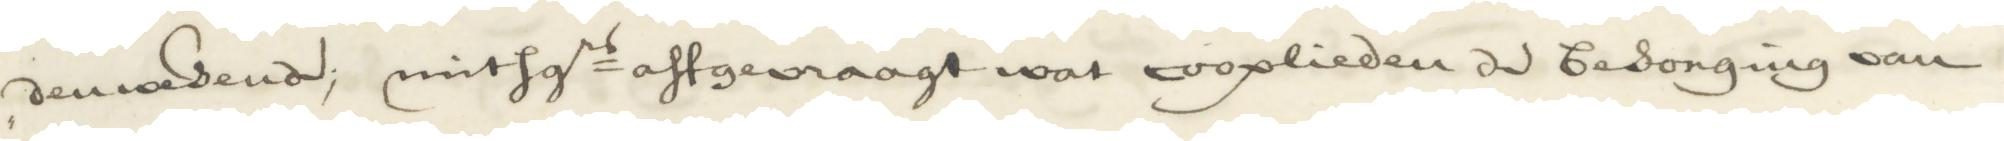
den wesende; mitsg=rs affgevraagt wat cooplieden de besorging van
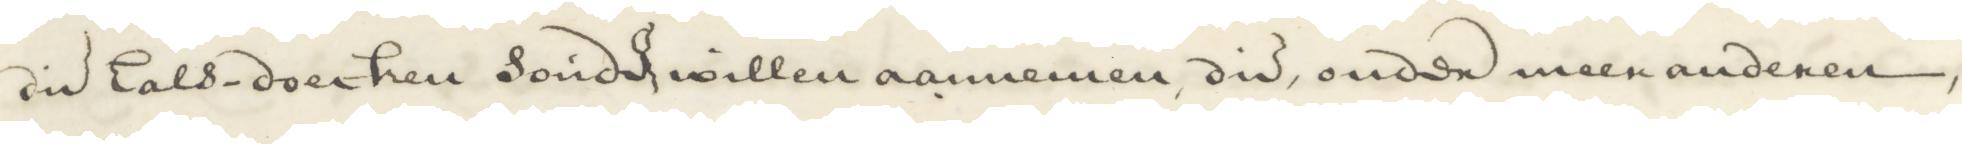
die hals-doecken souden willen aannemen, die, onder meer anderen,
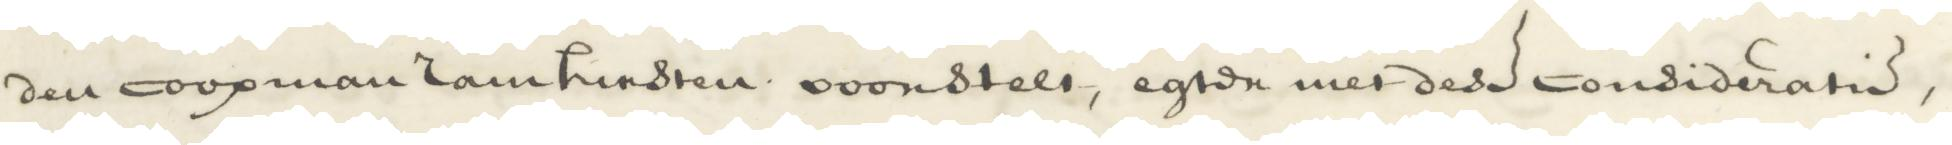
den coopman ramkirsten voorstelt, egter met dese consideratie,
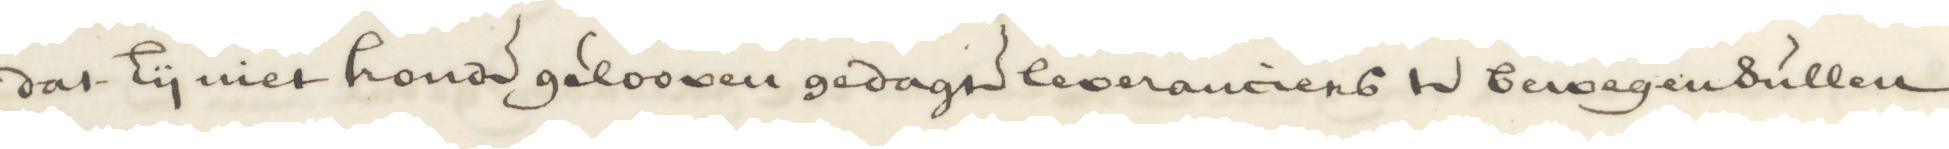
dat hij niet konde gelooven gedagte leveranciers te bewegen sullen
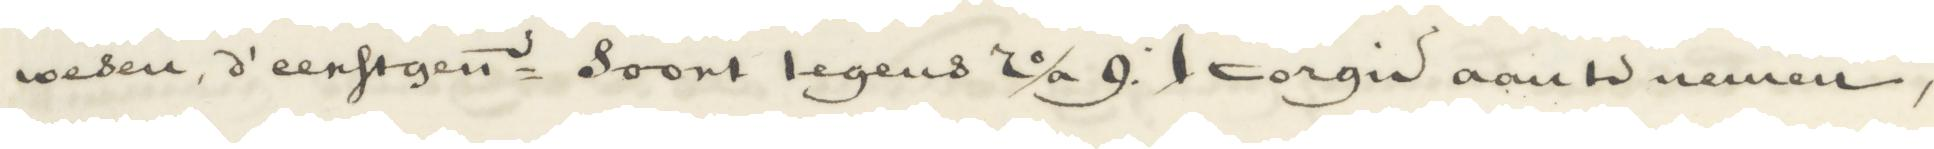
wesen, d’ eerstgen=e soort tegens r o/a 9. 't corgie aan te nemen,
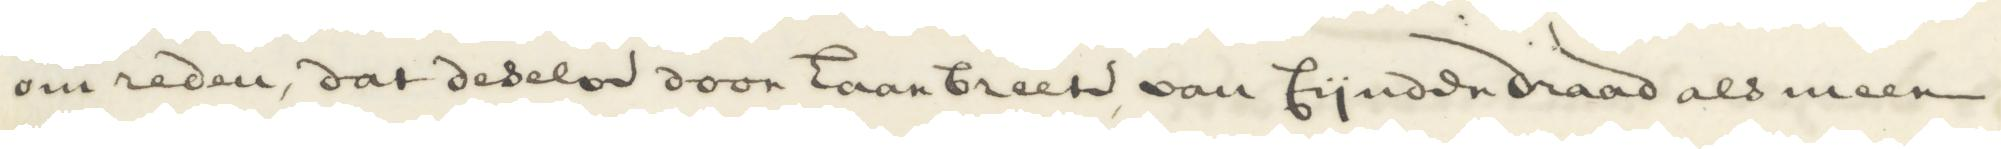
om reden, dat deselve door haar breete, van sijnder draad als meer
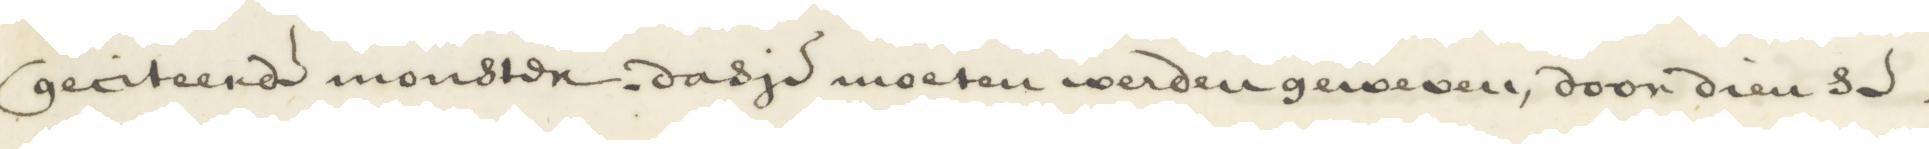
geciteerde monster-dasje moeten werden geweven, door dien se
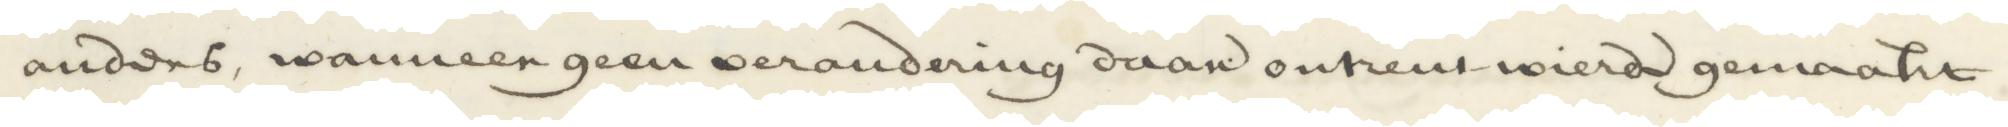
anders, wanneer geen verandering daar ontrent wierde gemaakt,
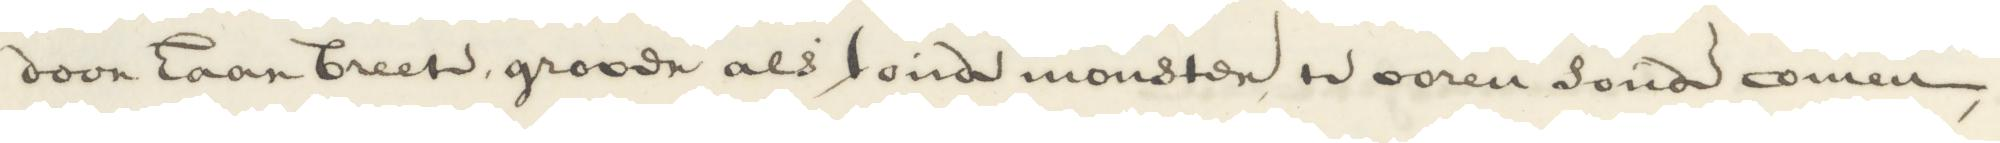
door haar breete, grover als t oude monster te voren soude comen,
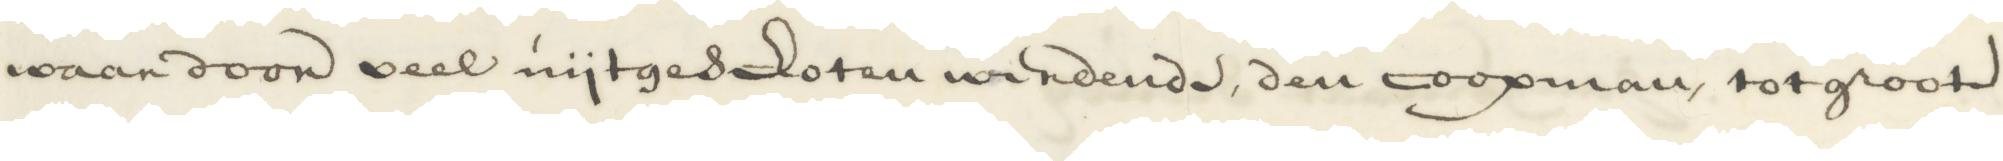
waar door veel uijtgeschoten werdende, den coopman, tot groote
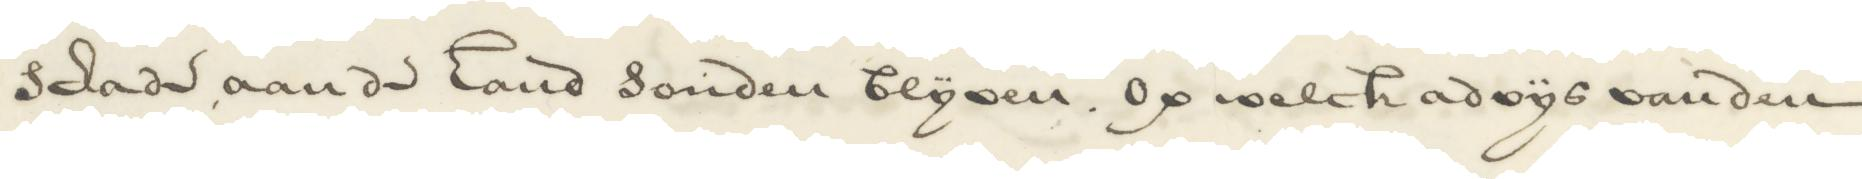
schade, aan de hand souden blijven. op welck advijs van den
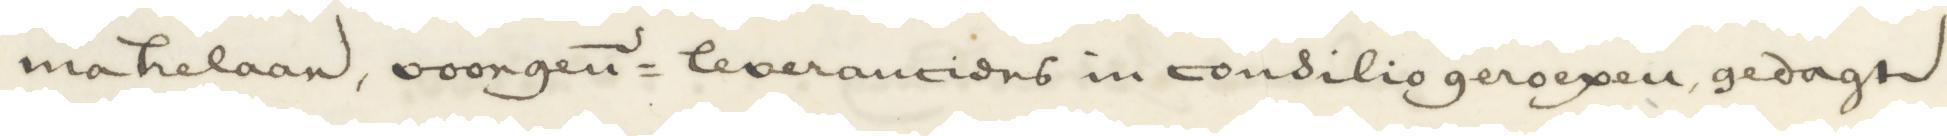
makelaar, voorgen=e leveranciers in consilio geroepen, gedagte
